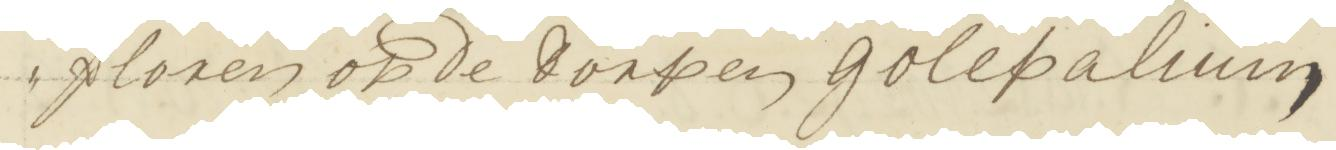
„ verloren op de dorpen golepalium
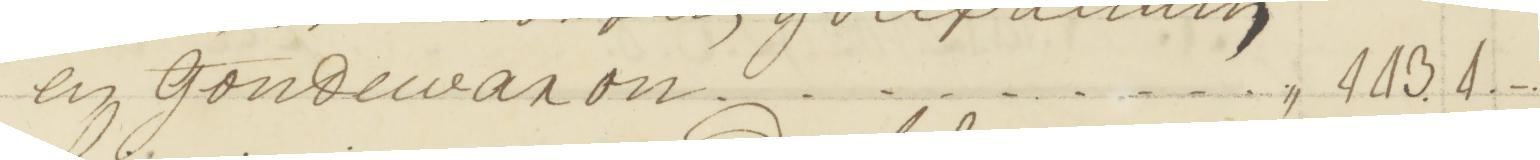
en Gondewaron . . . . . . . . . .„ 443.4.-.
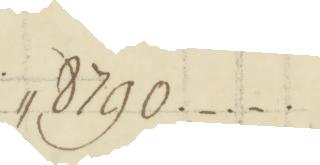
„8790.-.-.
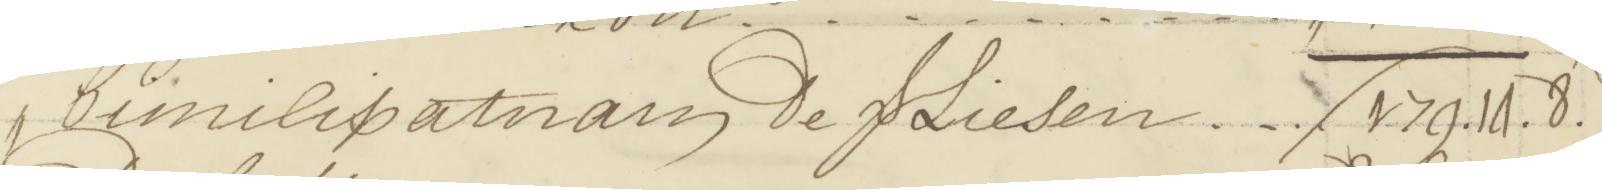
„ bimilipatnam de verliesen . - . ƒ 179.14.8.
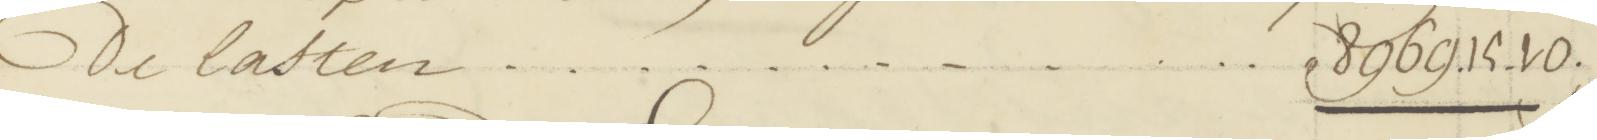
de lasten . . . . . . . . . . . . . „ 8969.15.10.
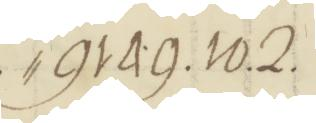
„9149.10.2.
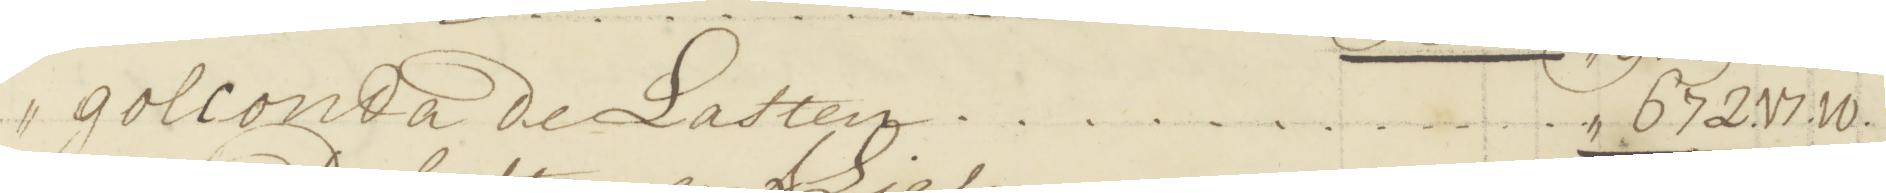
„golconda de Lasten . . . . . . . . . . . . „ 672.17.10.
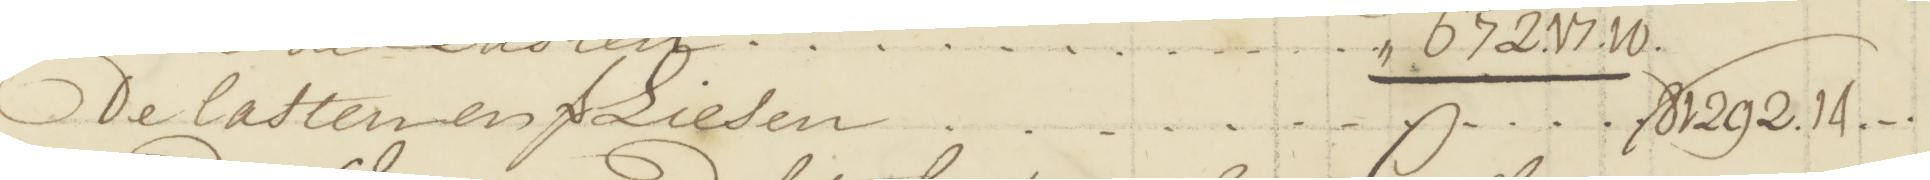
de lasten en verliesen . . . . . . . . . . . . ƒ81292.14.-.
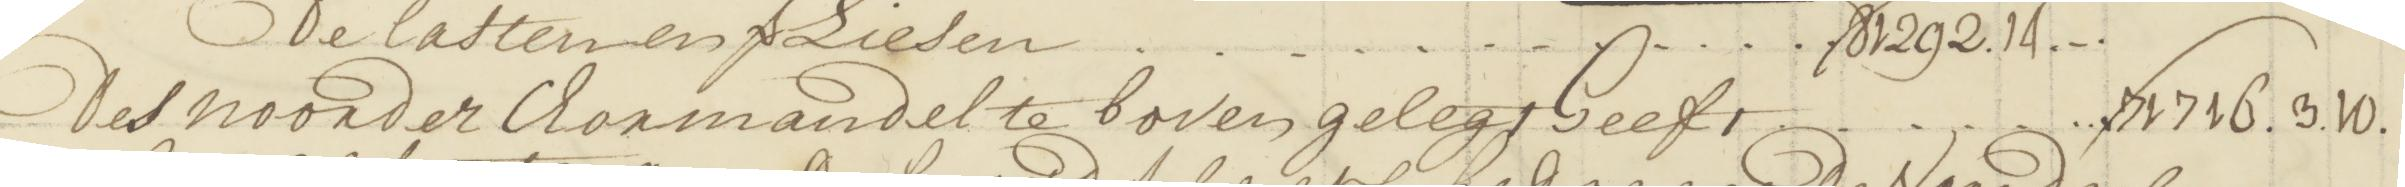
des noorder Chormandel te boven gelegt heeft . . . . . ƒ71716: 3.10.
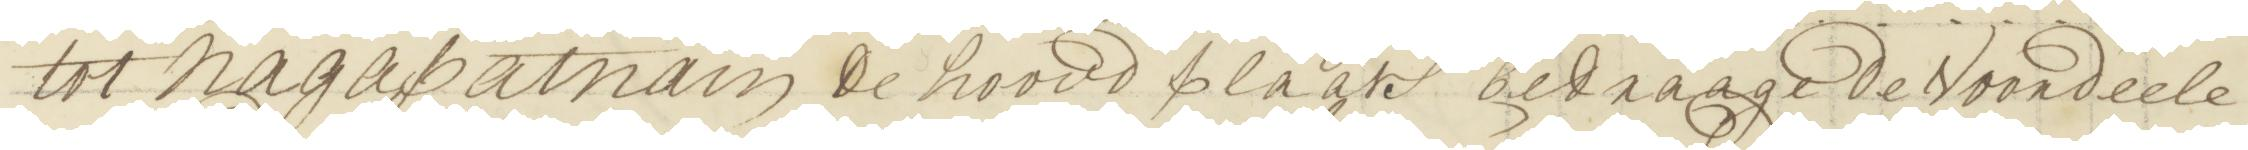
tot nagapatnam de hoovd plaats bedraage de voordeele
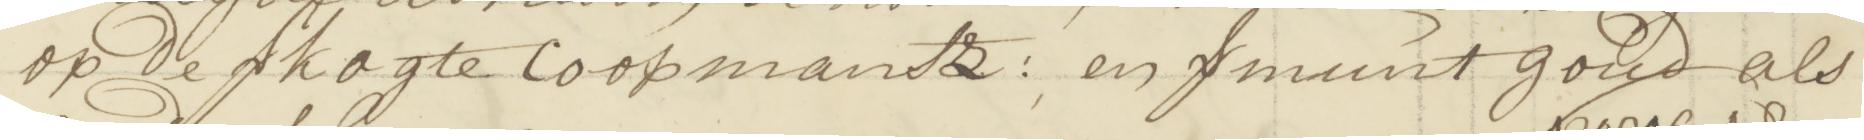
op de verkogte coopmansz: en vermunt goud als
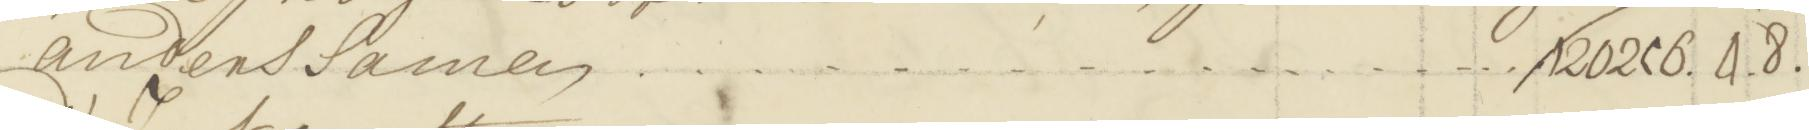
anders samen . . . . . . . . . . . . . . . . . . ƒ120256.4.8
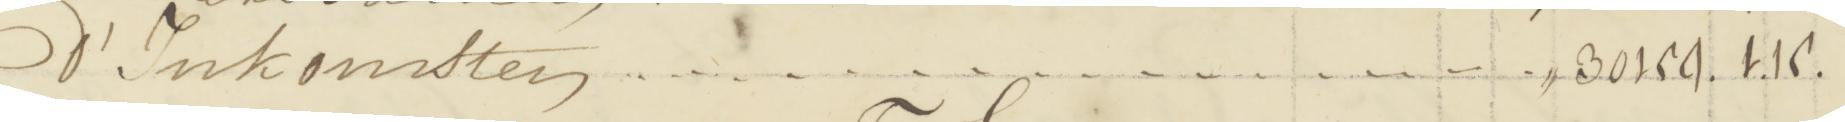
d’ Inkomsten . . . . . . . . . . . . . . . . . . . . . . . . „ 30154.1.15.
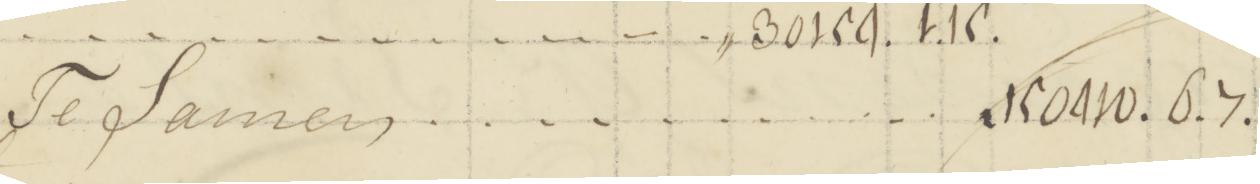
Te Samen . . . . . . . . . . . ƒ150410.6.7.
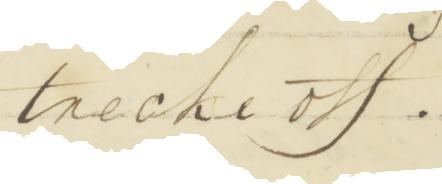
trecke off.
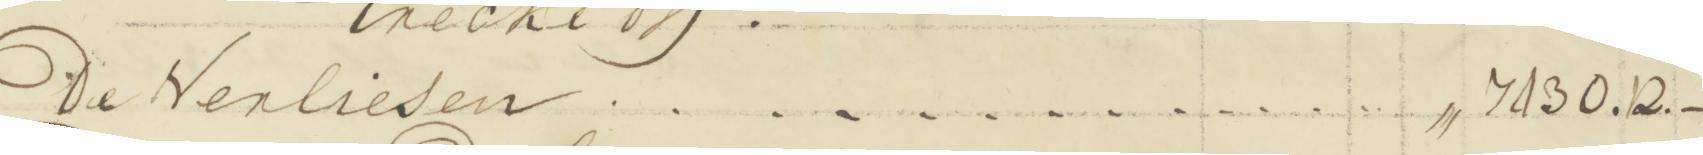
de Verliesen . . . . . . . . . . . . . . . . „ 7430.2.-
